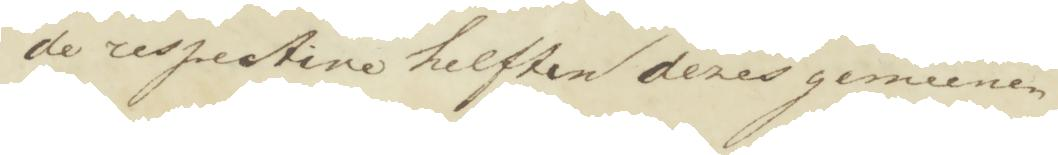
de respective helften dezes gemeenen
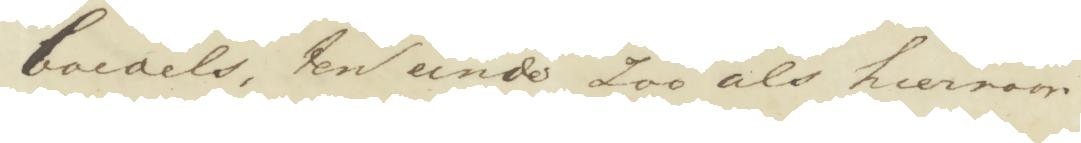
boedels, ten einde zoo als hiervoor
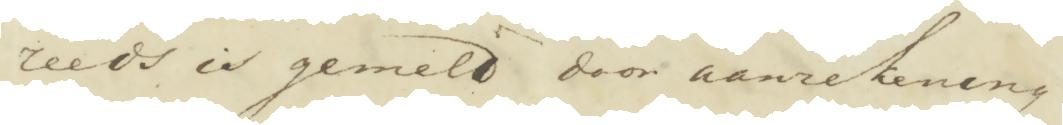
reeds is gemeld door aanrekening
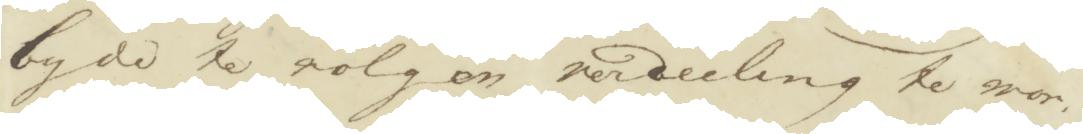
by de te volgen verdeeling te wor,
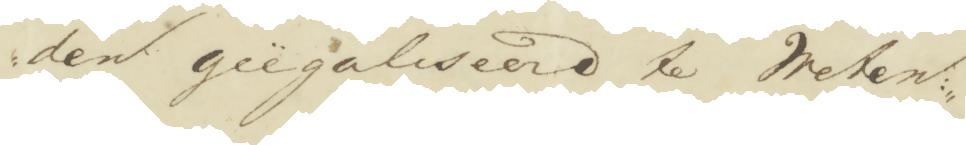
„den geëgaliseerd te weten:„
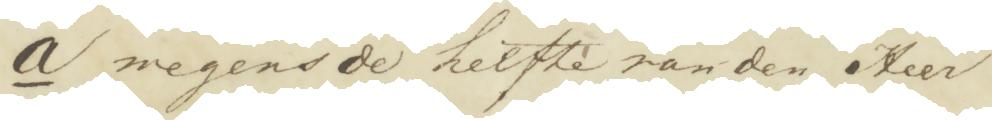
A wegens de helfte van den Heer
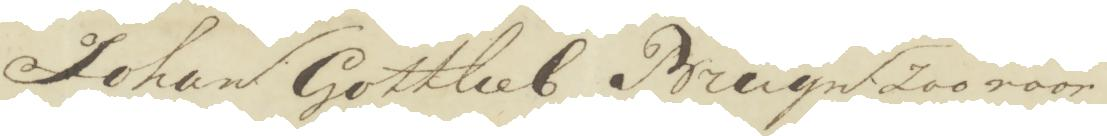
Johan Gottlieb Bruyn zoo voor
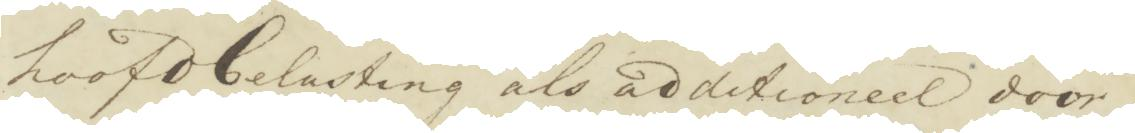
hoofd belasting als additioneel door
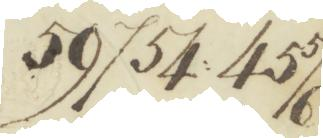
59754:45 5/6
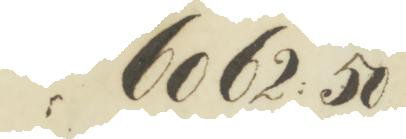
6062:50
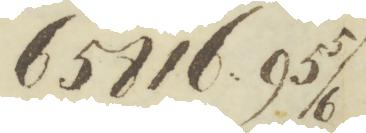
65816:95 5/6
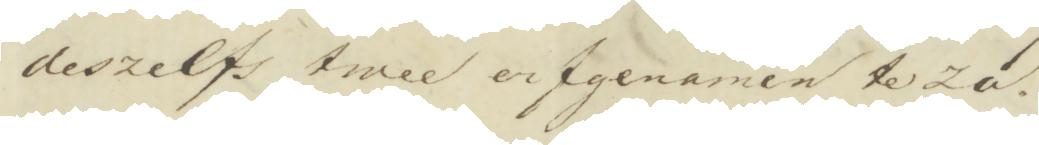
deszelfs twee erfgenamen te za,
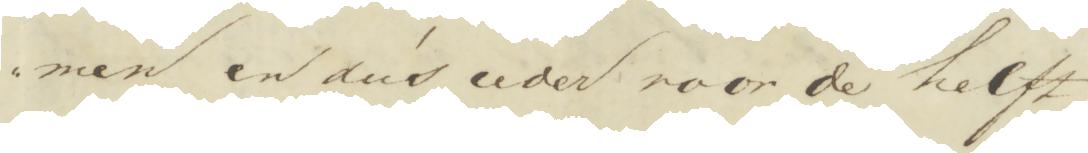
„men en dus ieder voor de helft
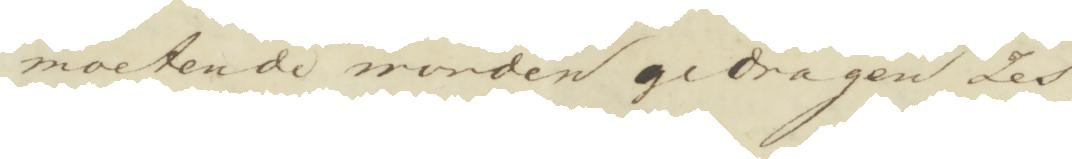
moetende worden gedragen zes
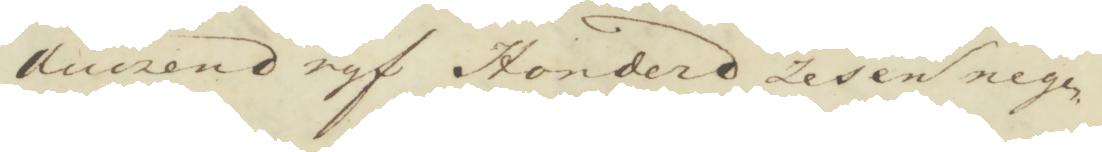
duizend vyf Honderd zes en negen,
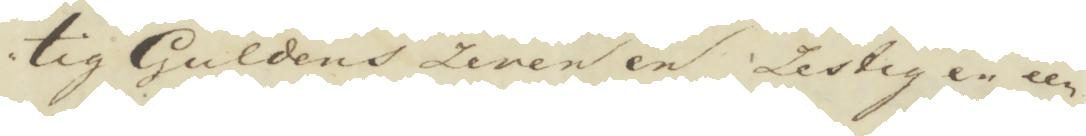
„tig Guldens zeven en zestig en een
